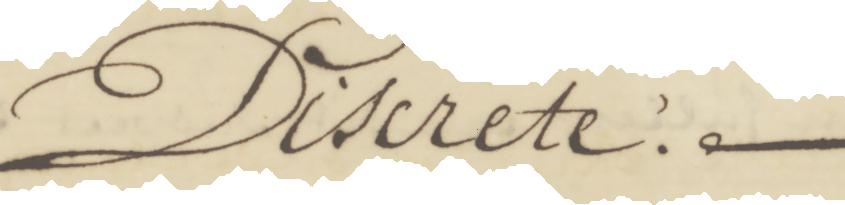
Discrete. —
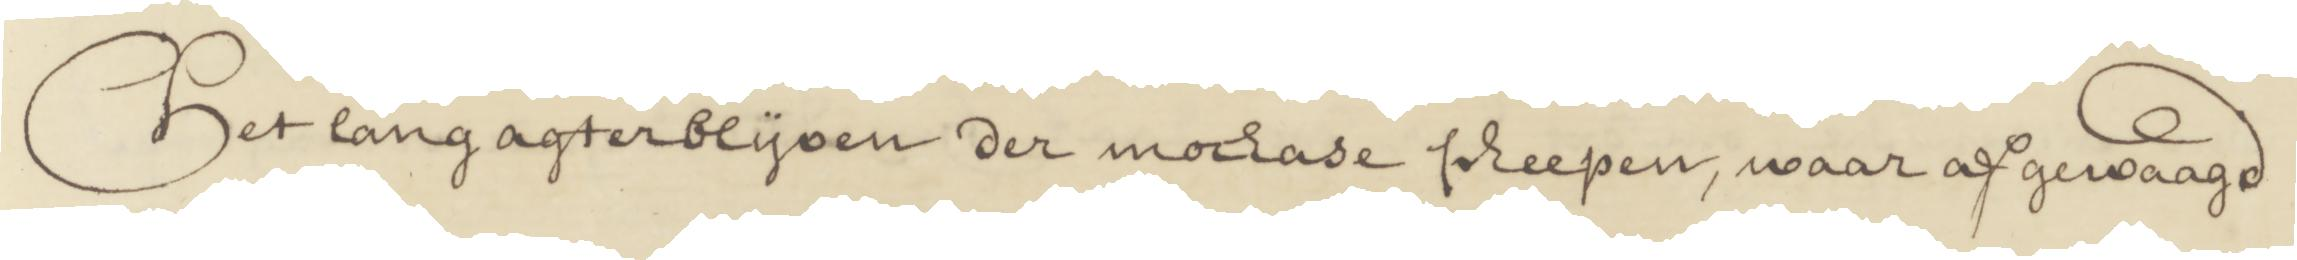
Het lang agterblijven der mochase scheepen, waar afgewaagd
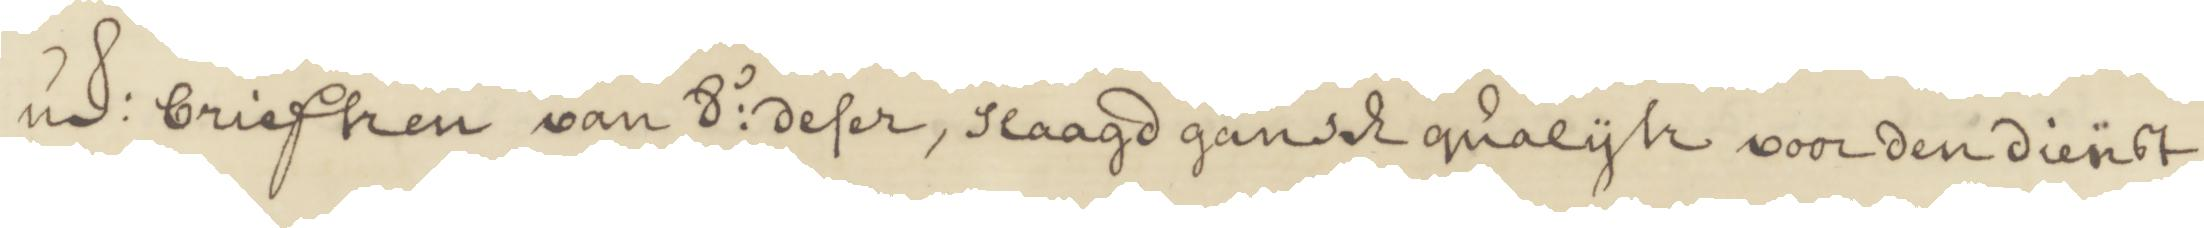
uE: briefken van 8:' deser, slaagd gansch qualijk voor den dienst
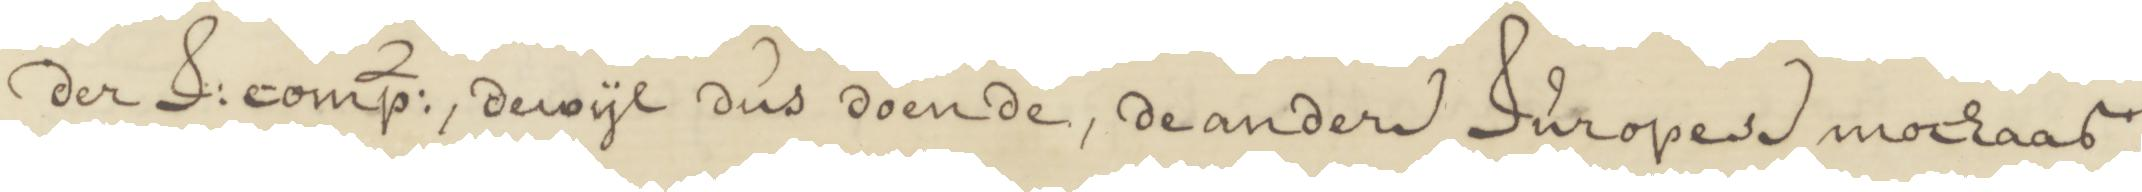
der E: comp:, dewijl dus doende, de andere Europese mochaas
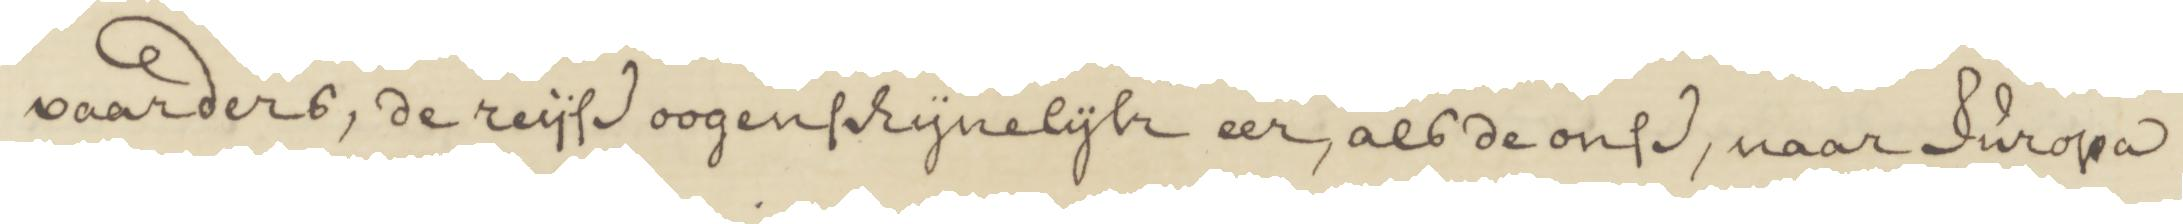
vaarders, de reijse oogenschijnelijk eer, als de onse, naar Europa
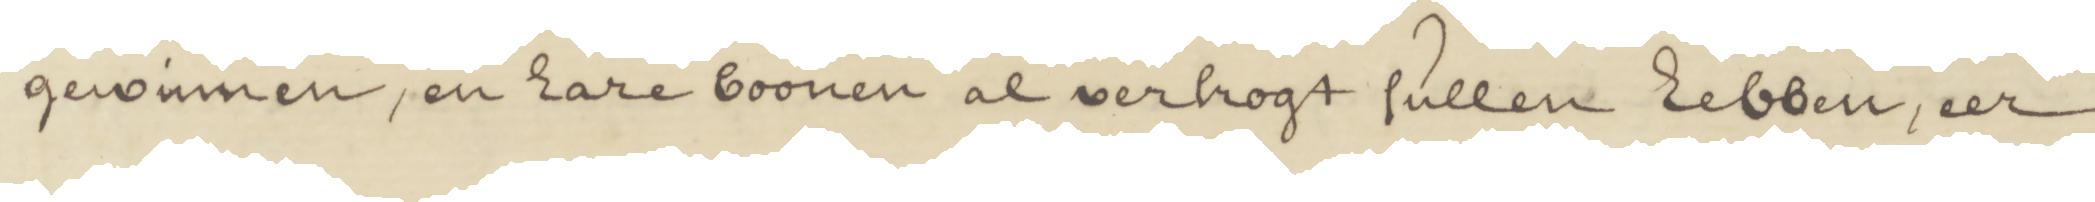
gewinnen, en hare boonen al verkogt sullen hebben, eer
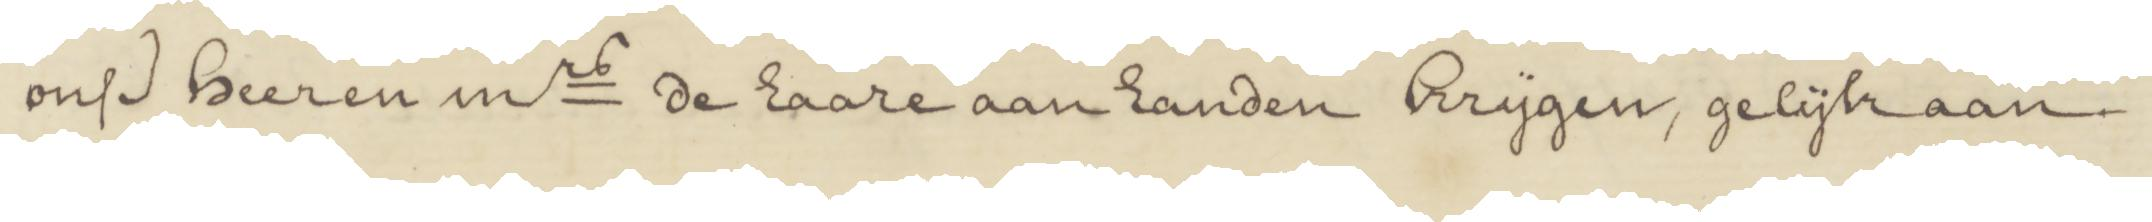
onse heeren m=rs de haare aan handen krijgen, gelijk aan
